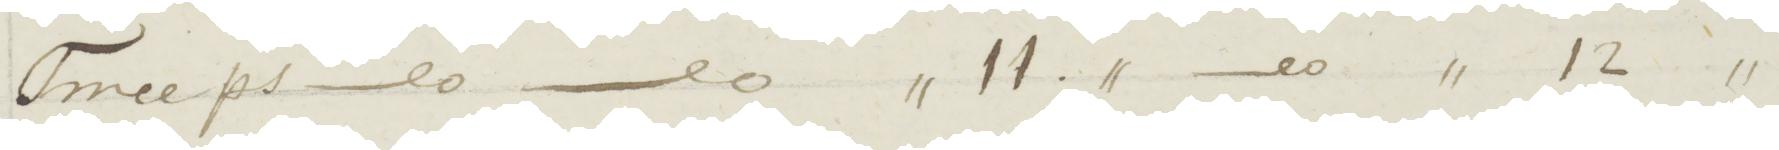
Twee ps _o _o „ 11. „ _o „ 12 „
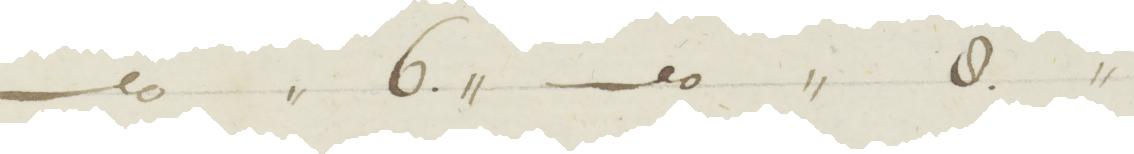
_o „ 6. „ _o „ 8. „
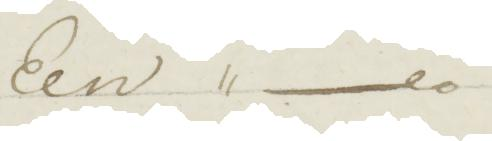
Een „ _o
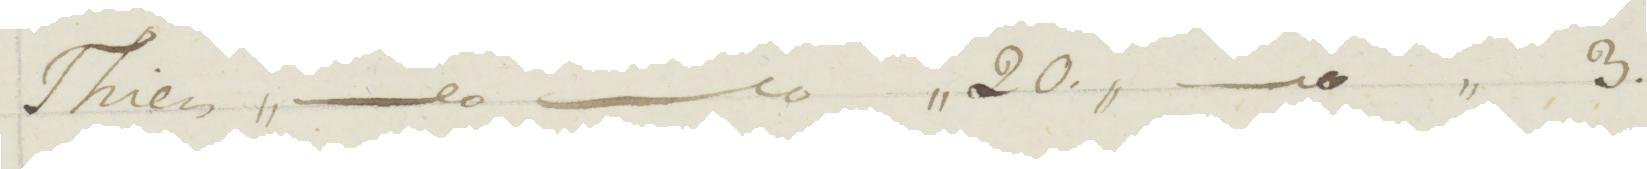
Thien „ _o _o „ 20. „ _o „ 3.
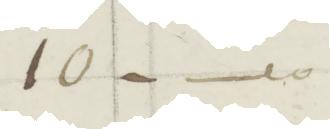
10 _ _o
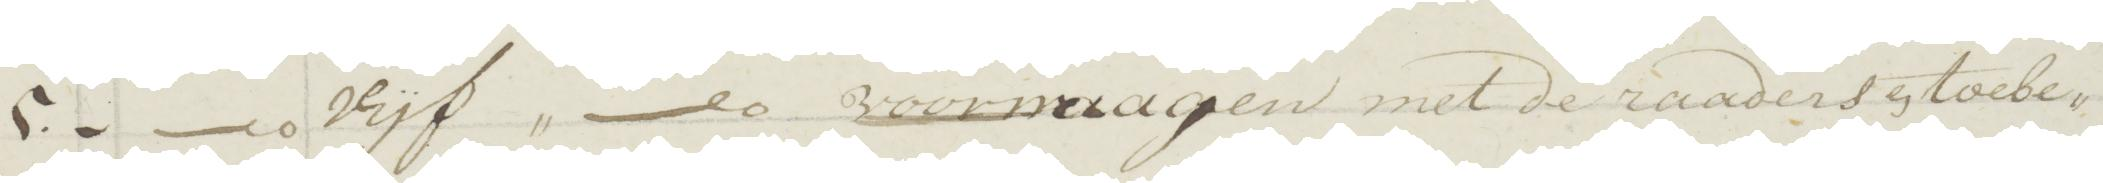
5._ _o vijf „ _o voorwaagen met de raaders en toebe„
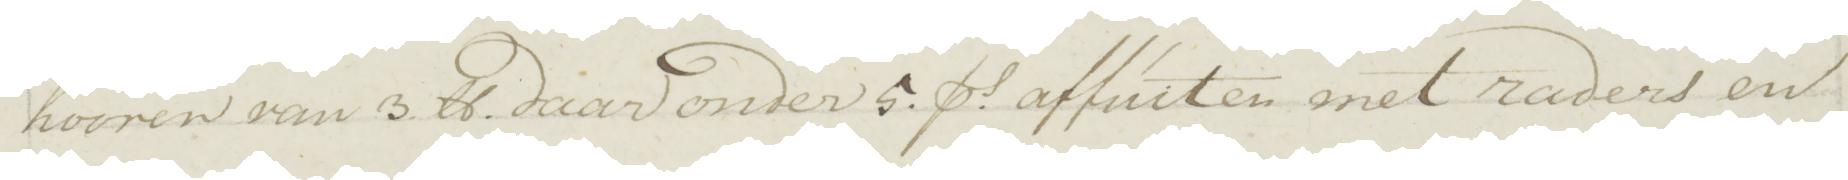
hooren van 3. lb. daar onder 5. p.s affuiten met raders en
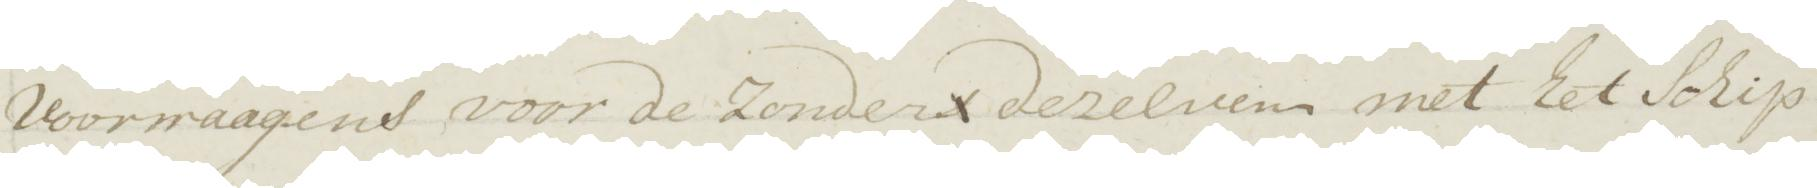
voorwaagens voor de zonders dezelven met het schip
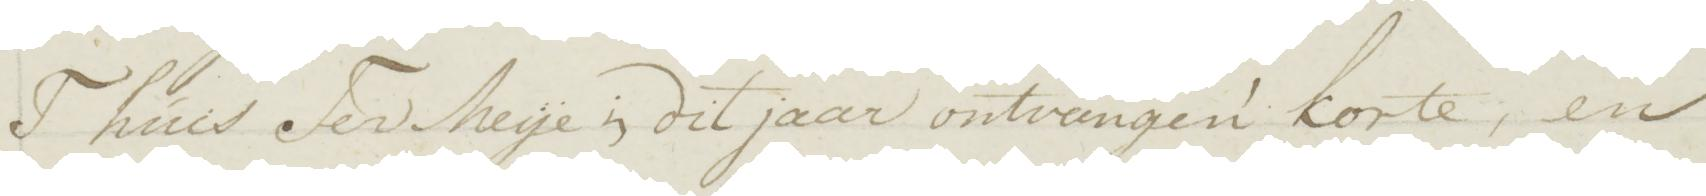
T huis Ter Meije in dit jaar ontvangen korte, en
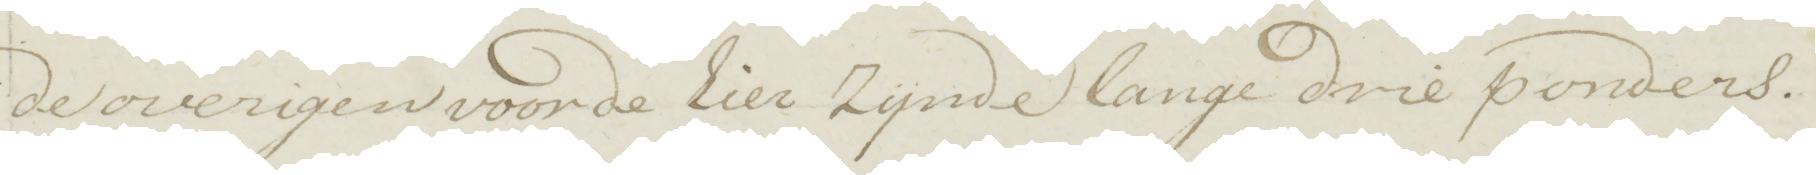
de overigen voor de hier zijnde lange drie ponders.
